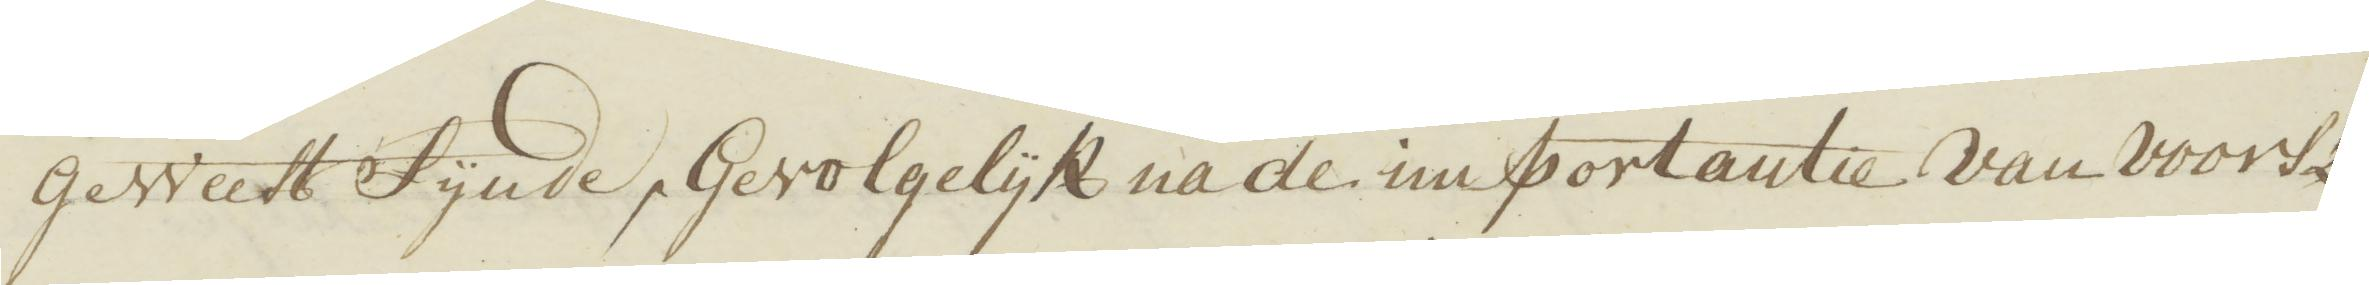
geweest sijnde, Gevolgelijk na de importantie van voorsz
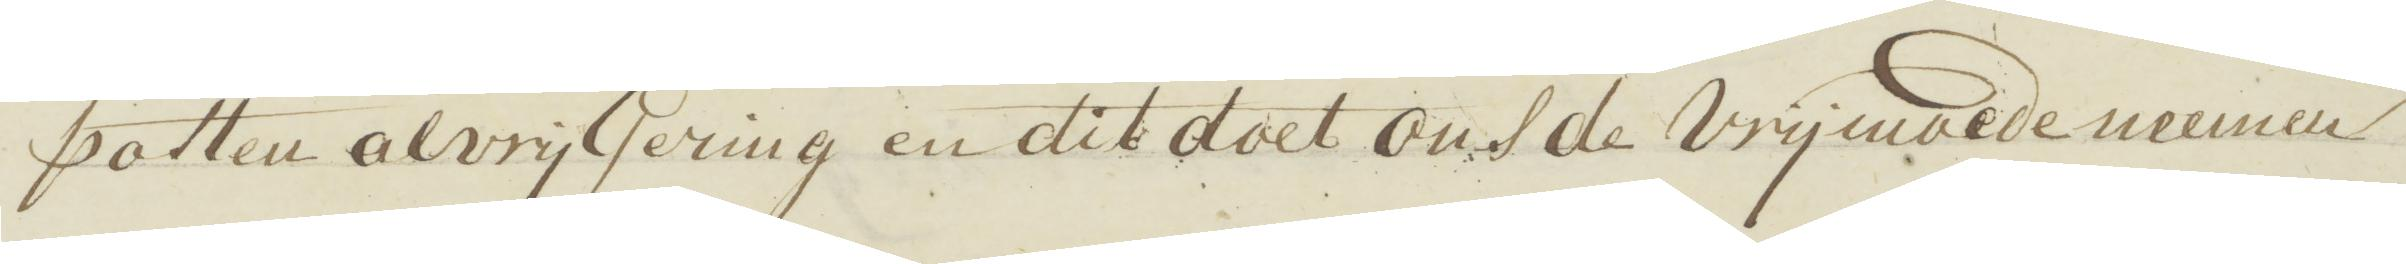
posten alvrij Gering en dit doet ons de vrijmoede neemen
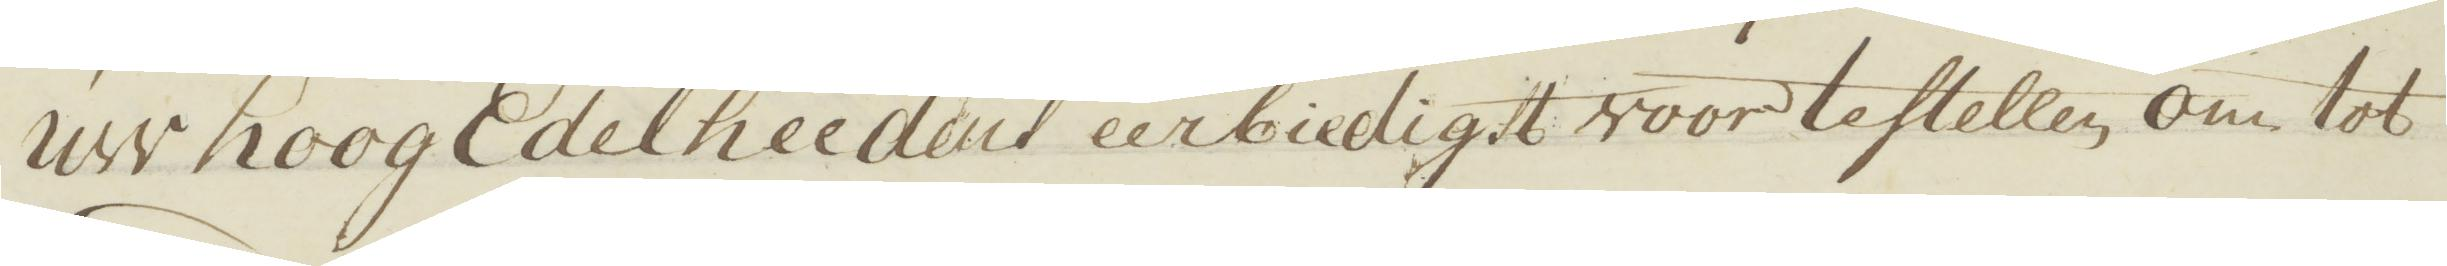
uw hoog Edelheedens eerbiedigst voor te stellen om tot
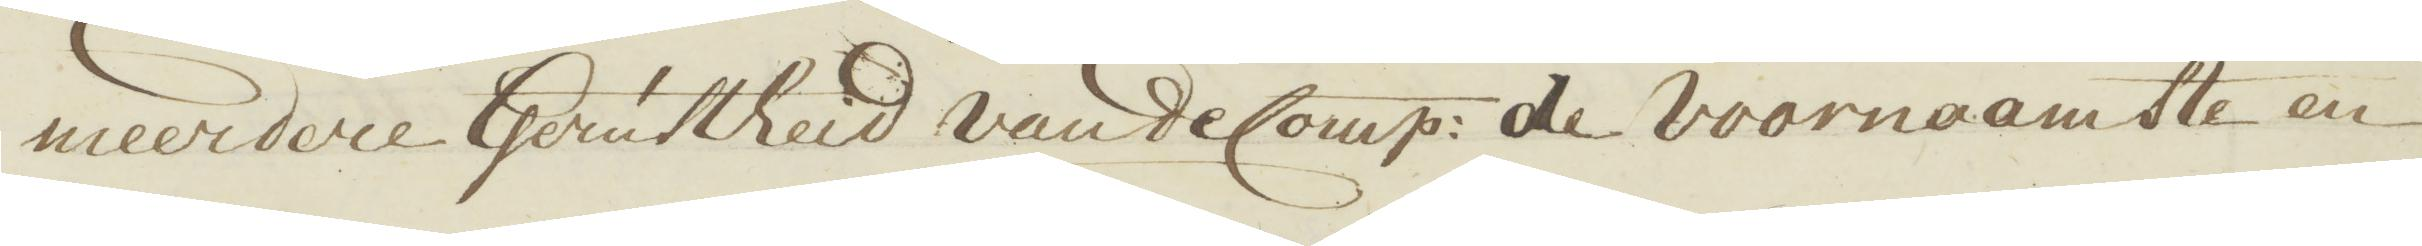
meerdere Gerustheid van de Comp: de voornaamste en
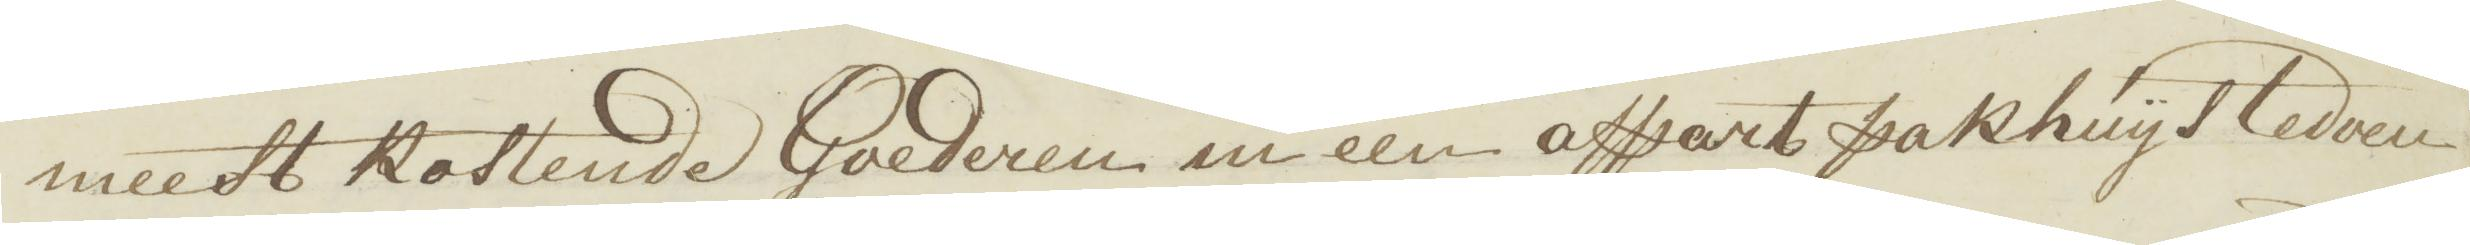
meest kostende Goederen in een appart pakhuijs te doen
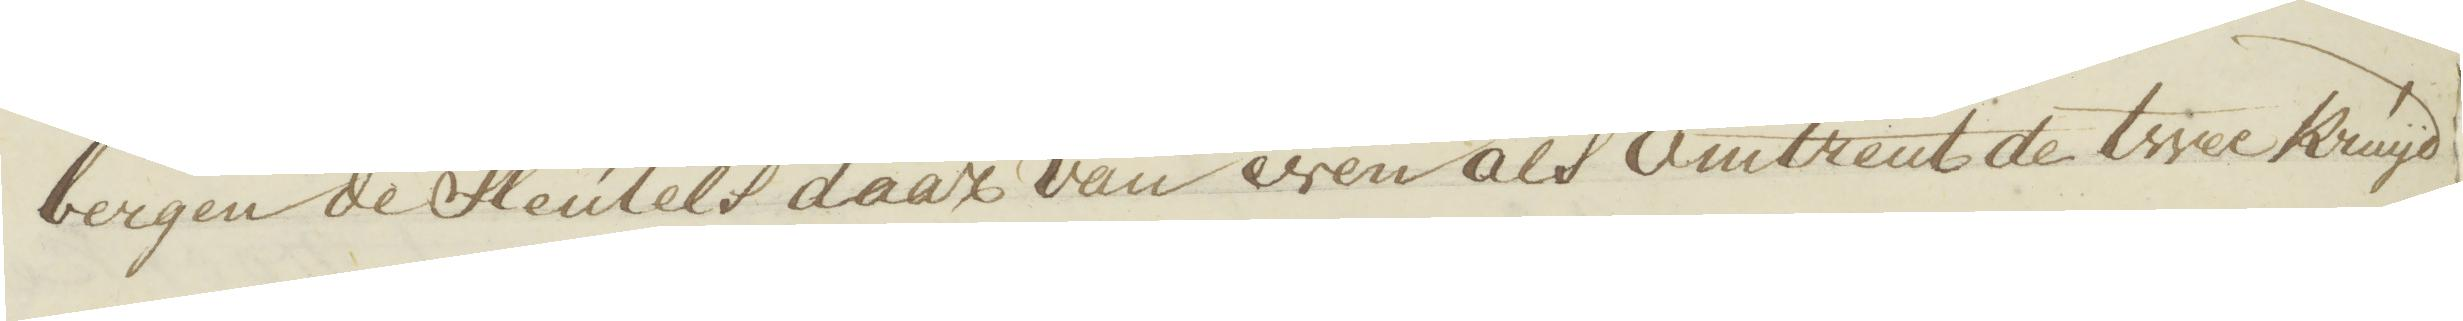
bergen de sleutels daar van even als Omtrent de twee kruijd
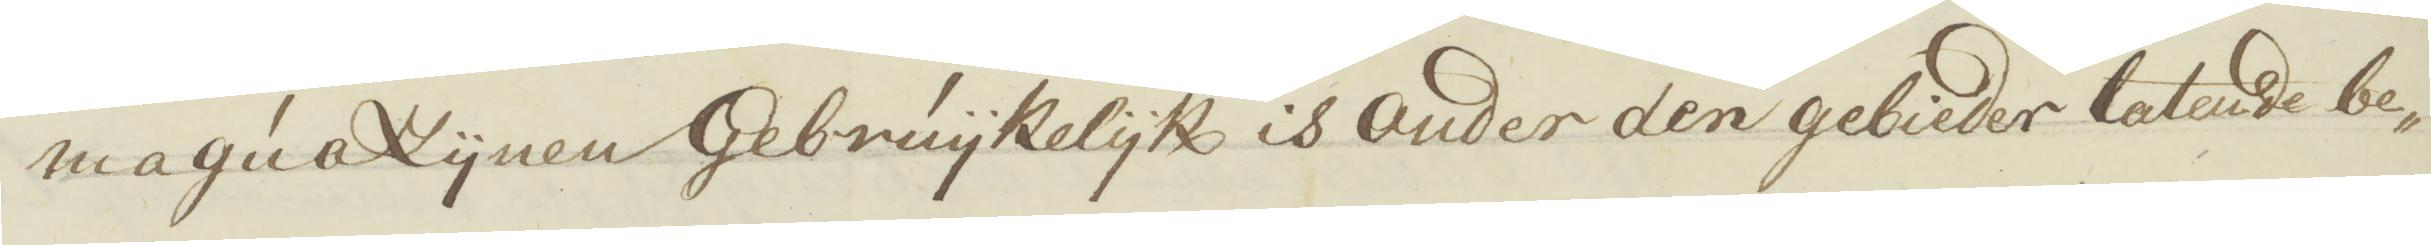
maguazijnen Gebruijkelijk is onder den gebieder latende be„
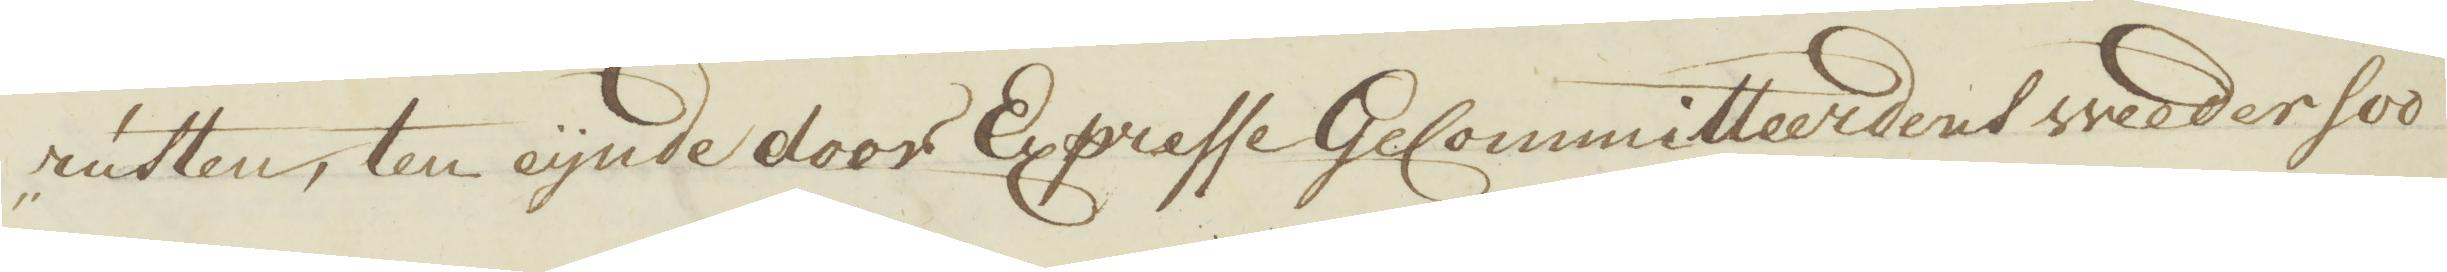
„rusten, ten eijnde door Expresse Gecommitteerdens weeder soo
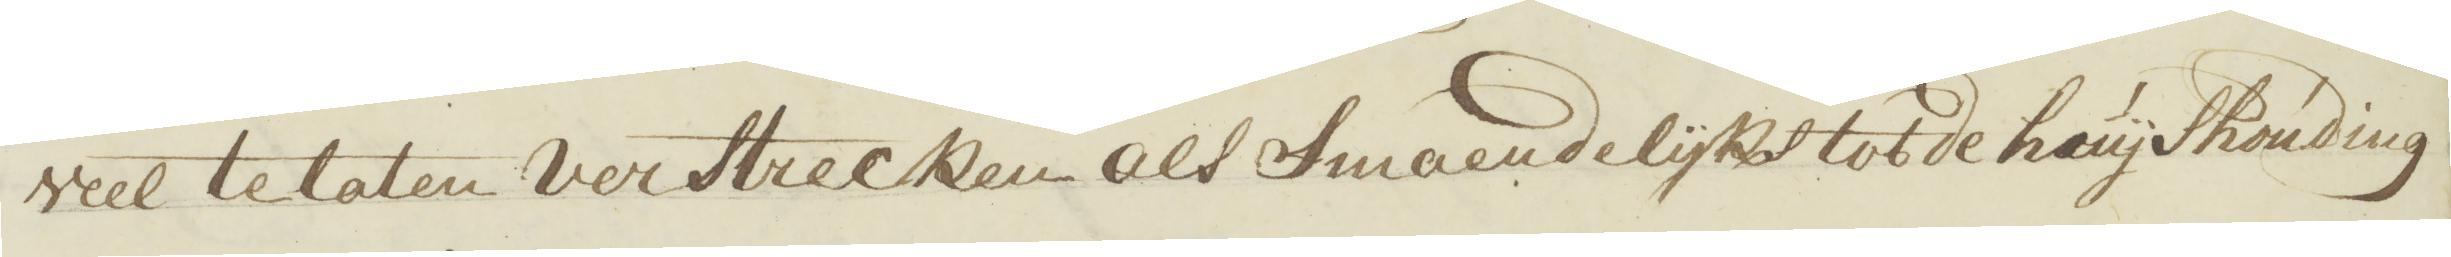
veel te laten verstrecken als smaendelijks tot de huijshouding
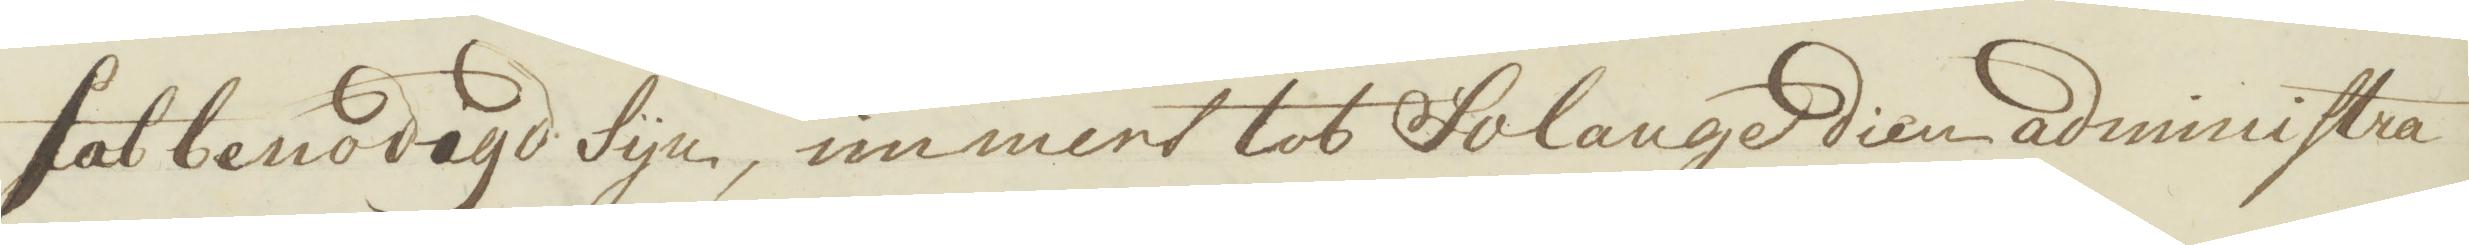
sal benodigd sijn, immers tot solange dien administra
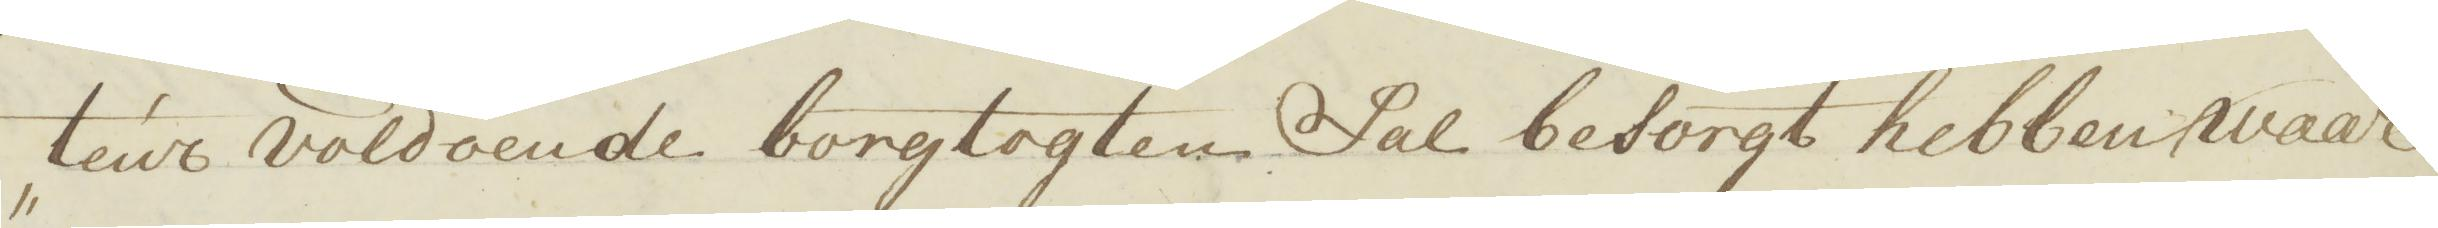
„teur voldoende borgtogten sal besorgt hebben waar
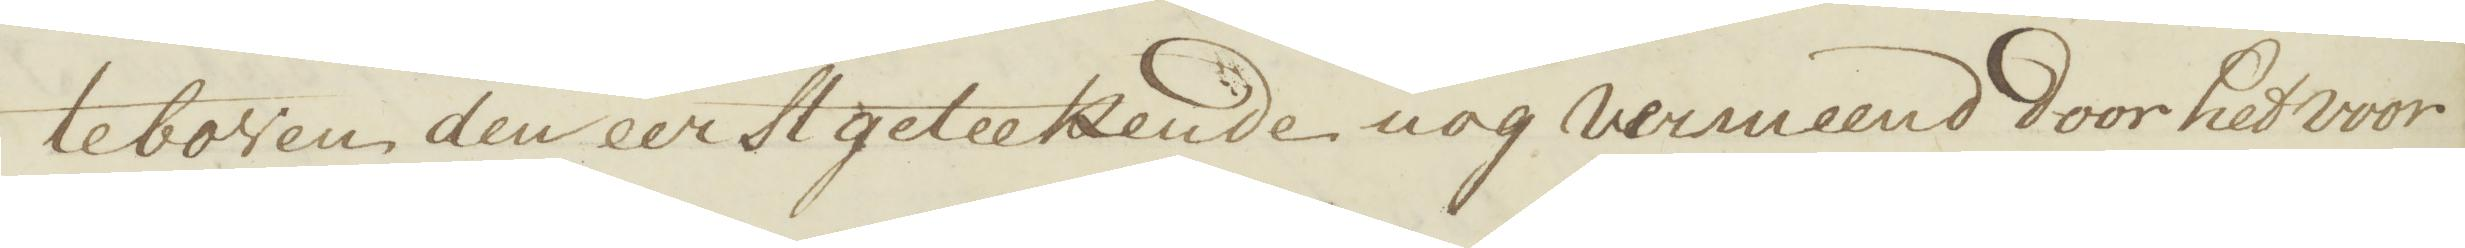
te boven den eerst geteekende nog vermeend door het voor
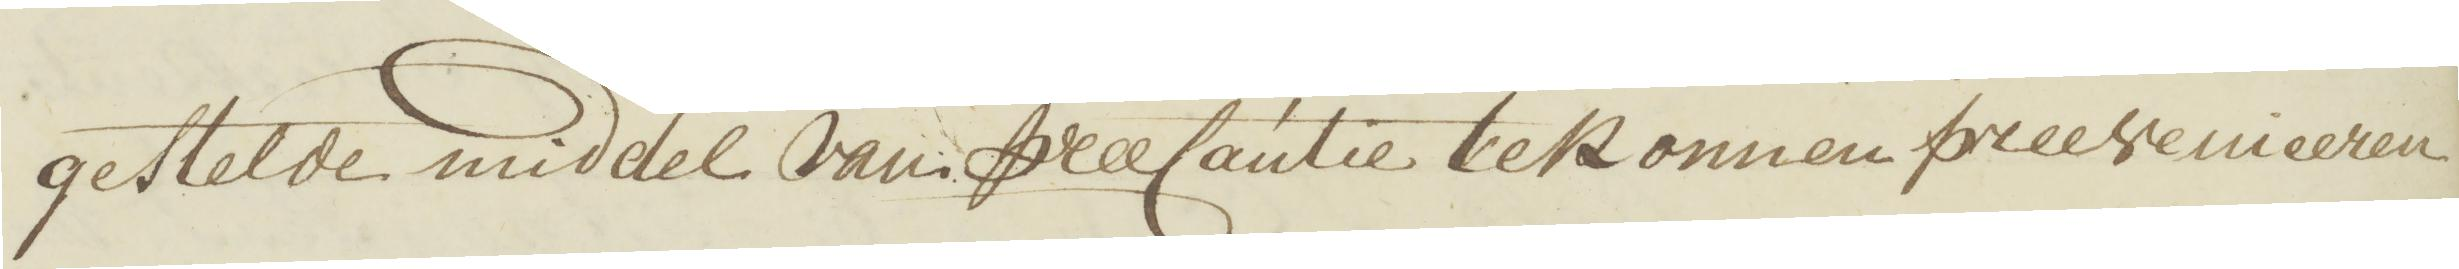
gestelde middel van praecautie te konnen preevenieeren
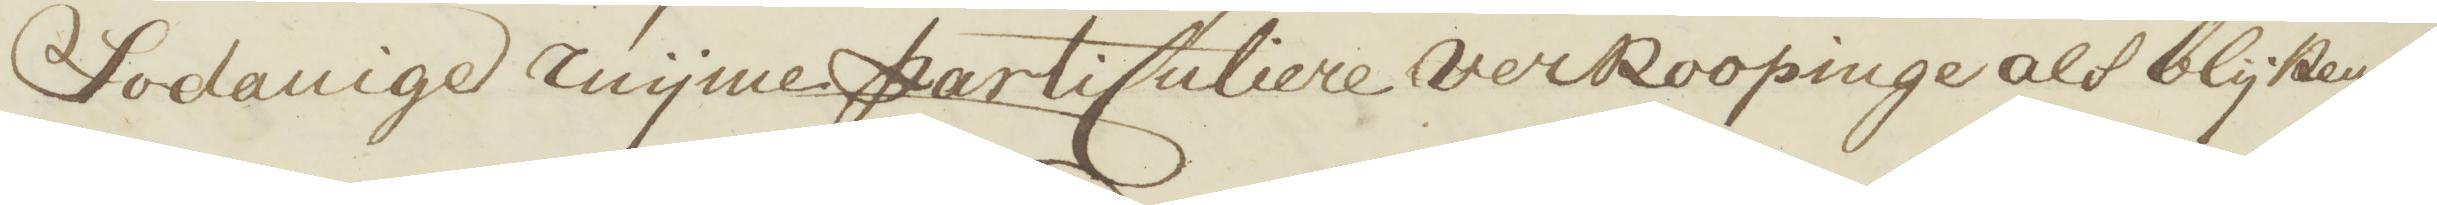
sodanige ruijme particuliere verkoopinge als blijkens
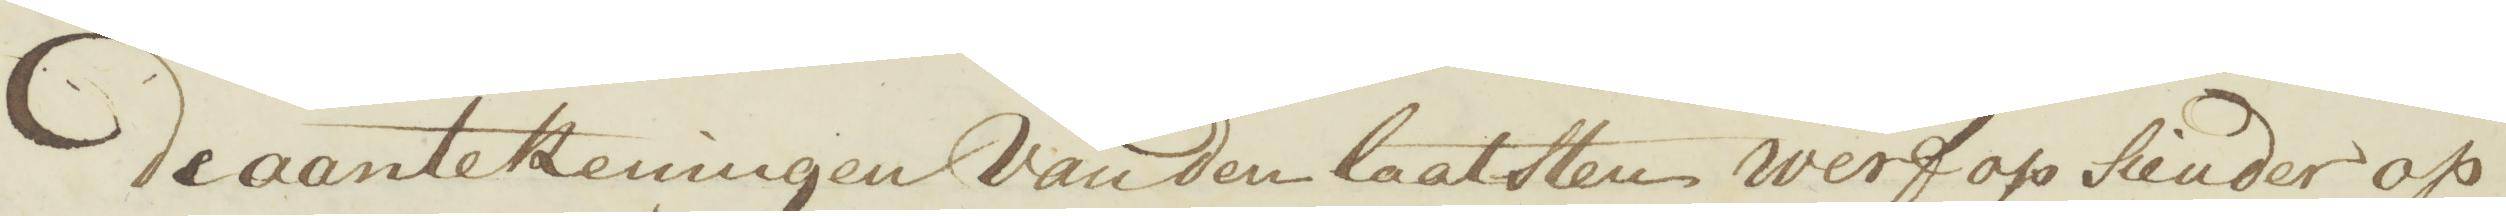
de aantekeningen van den laatsten werf op siender op
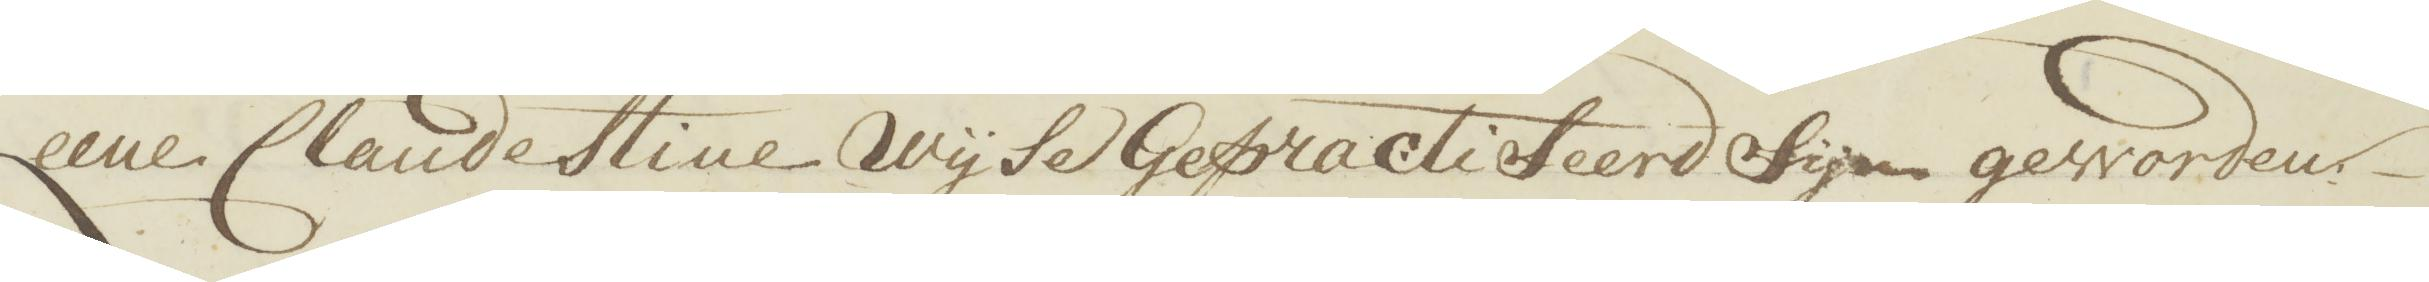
eene Clandestine wijse Gepractiseerd sijn geworden
